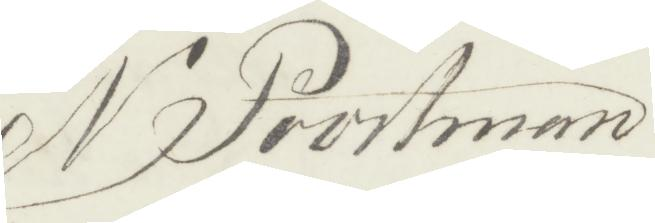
I N Poortman
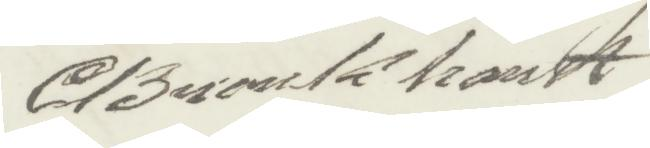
CBronkhorst
